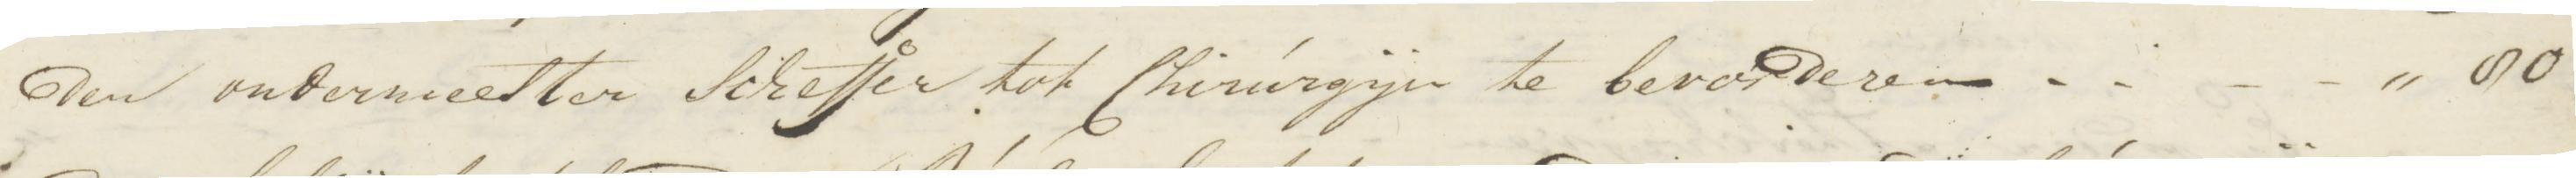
den ondermeester scheffer tot Chirurgijn te bevorderen - - – – „ 80
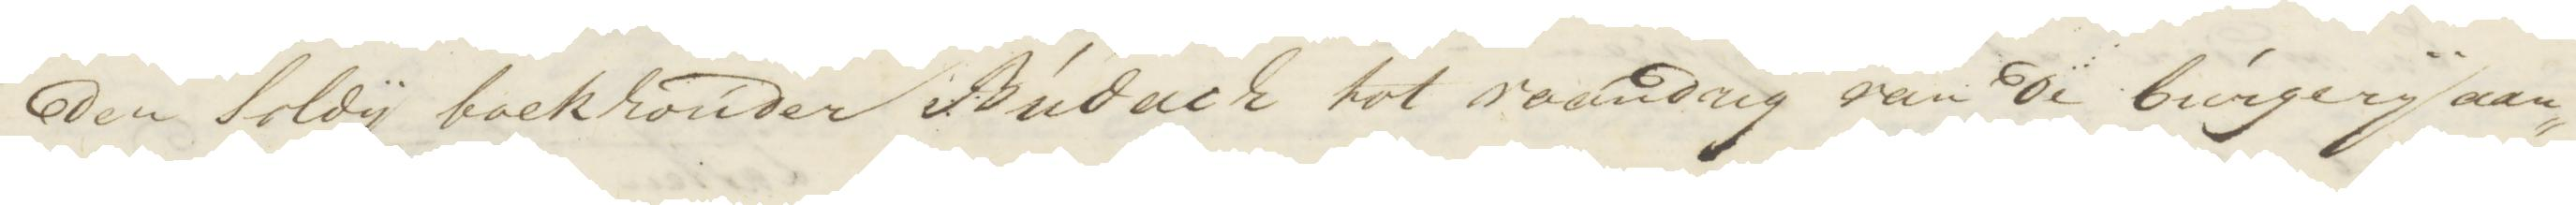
den soldij boekhouder Budach tot vaandrig van de burgerij aan„
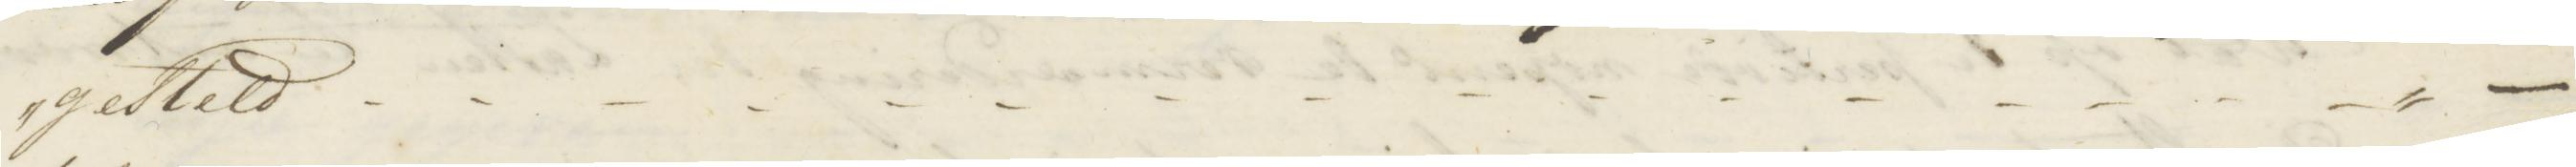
gesteld – – – – – – – – – – - – – – – – „ —
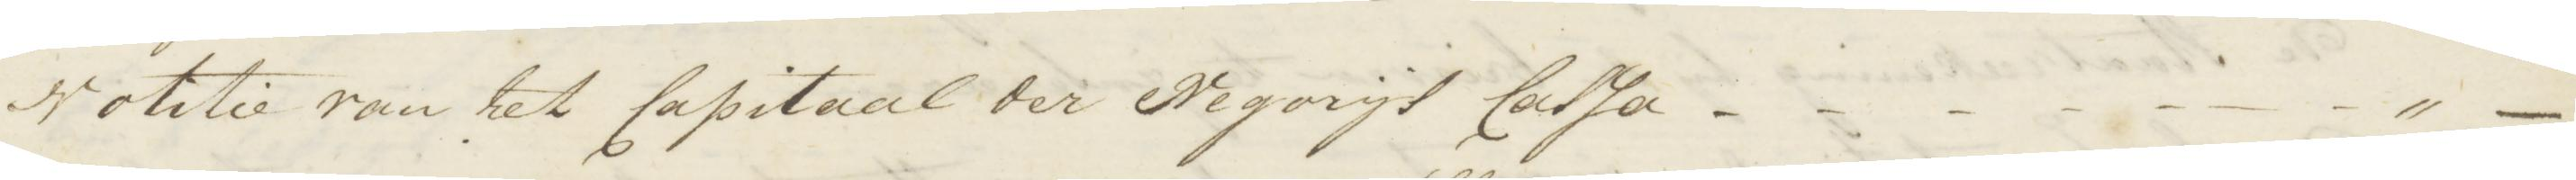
Notitie van het Capitaal der Negorijs Cassa – – – – – – – „ —
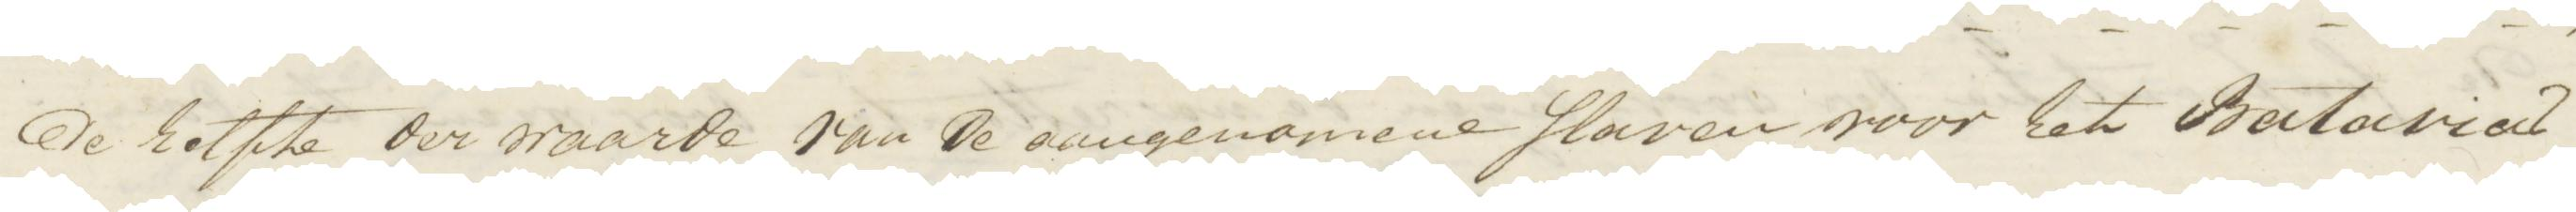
de helfte der waarde van de aangenomene slaven voor het Batavia
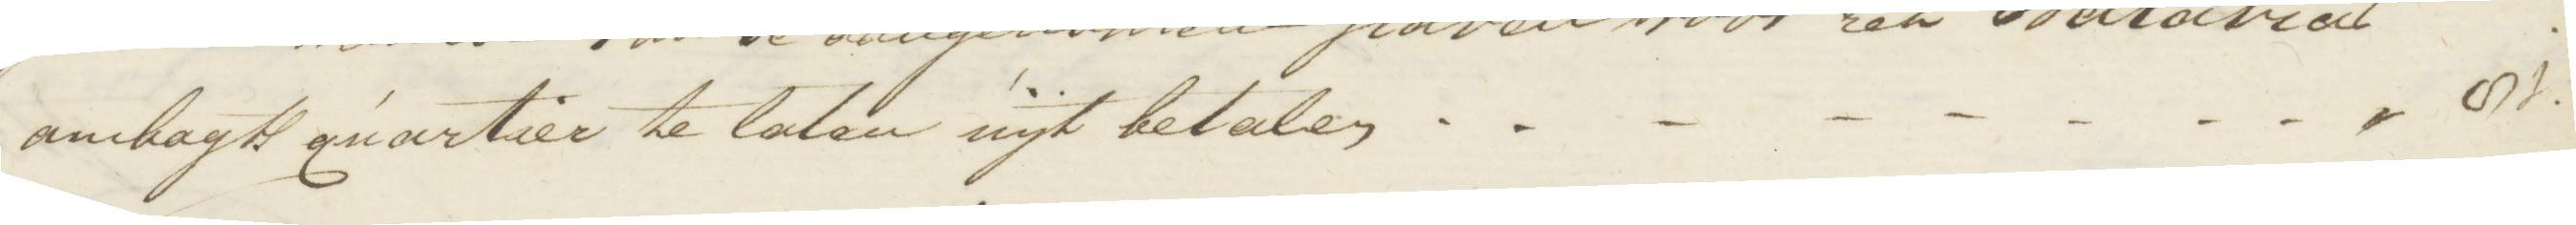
ambagts quartier te laten uijt betalen - - – – – – – – „ 81
